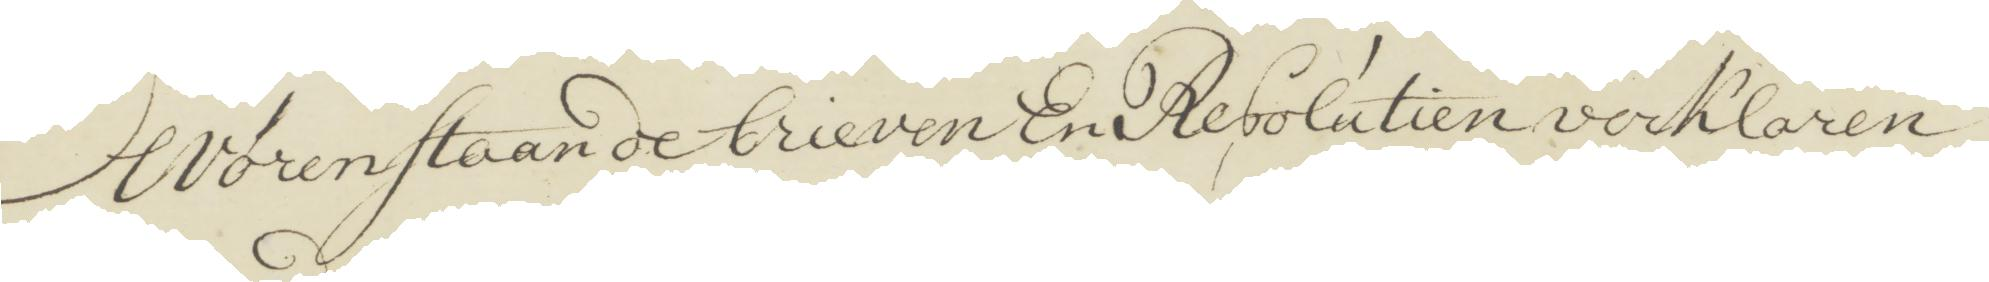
De vorenstaande brieven En Resolutien verklaren
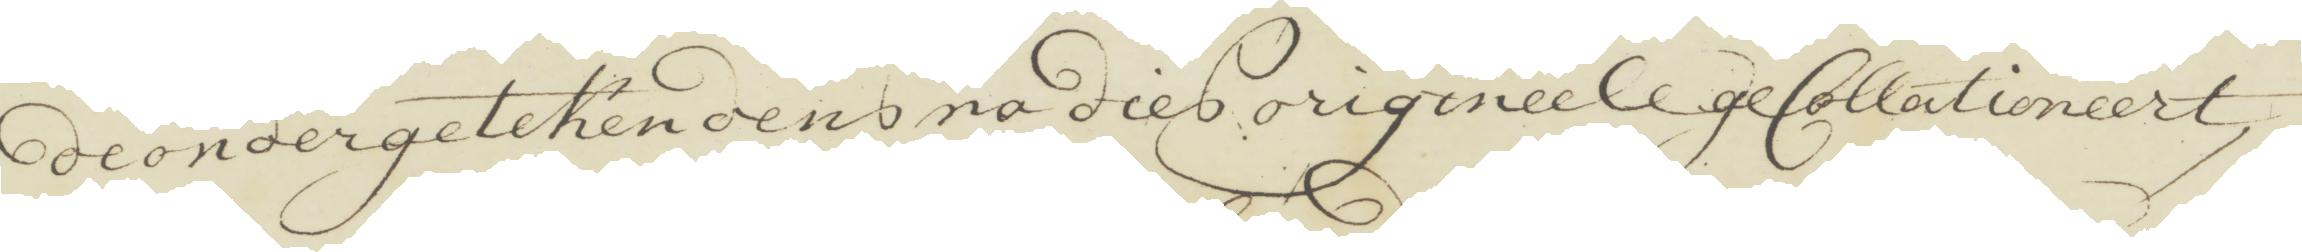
de ondergetekendens na dies origineele gecollationeert
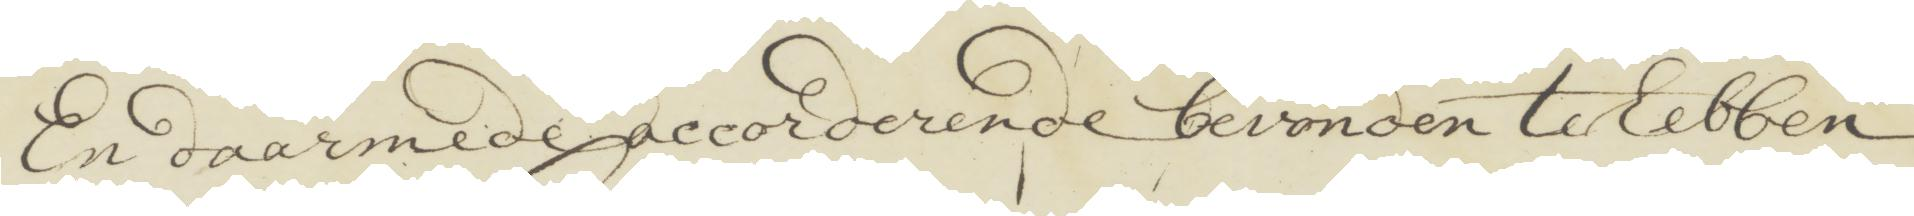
En daarmede accorderende bevonden te hebben
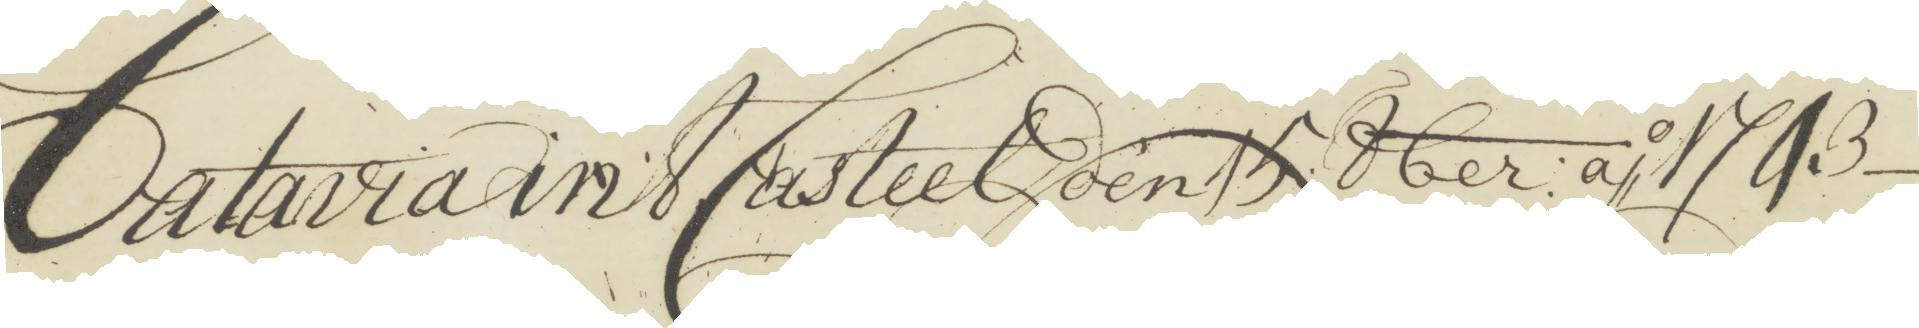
Batavia in’t Casteel den 15:en 8ber: a„o 1743 —
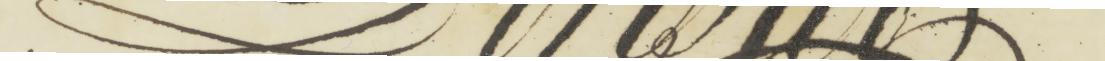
Linsut
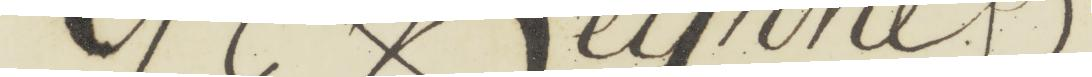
G„ge E„as Heijnne
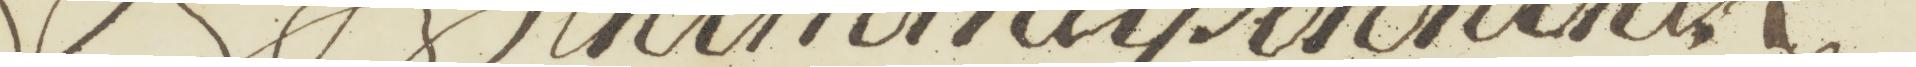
J„r G„ Schimmelpenninck
